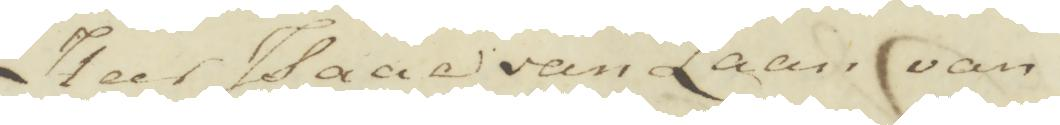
Heer Jsaac van Laan van
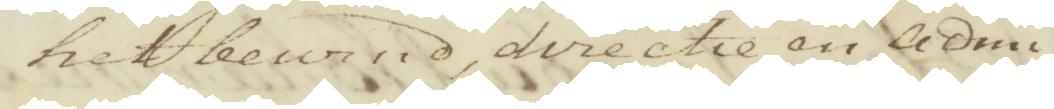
het bewind, directie en admi
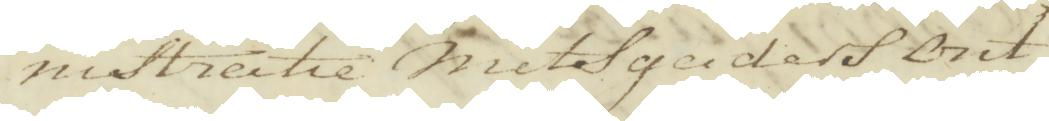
„nistratie mitsgaders ont
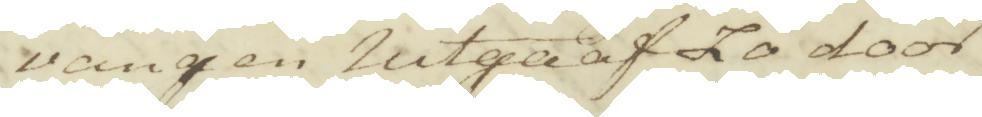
vangen uitgaaf zo door
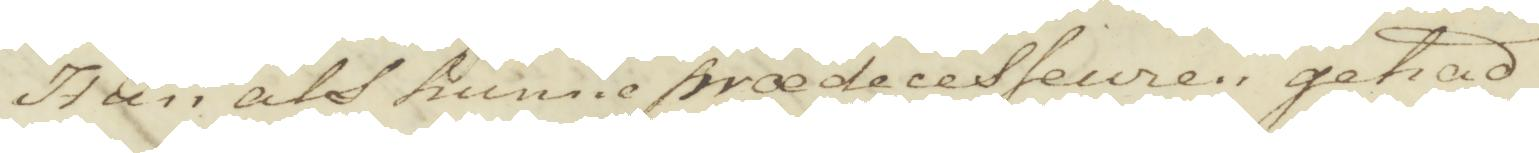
Hun als hunne proedecesseuren gehad
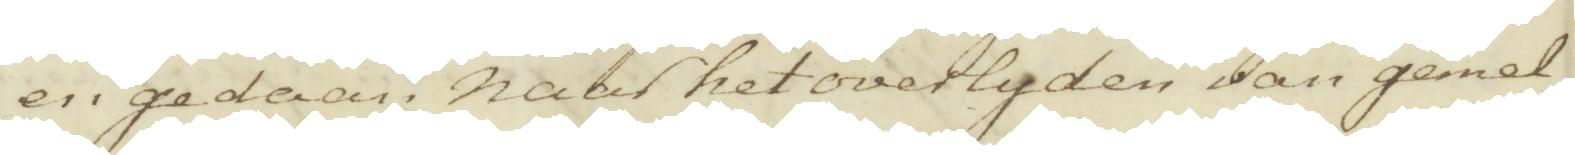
en gedaan naar het overlyden van gemel
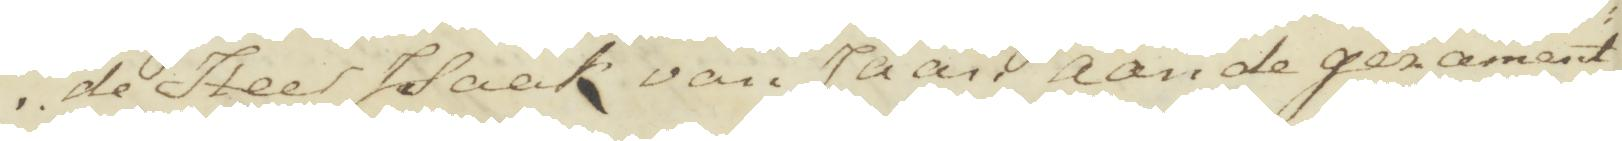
„de Heer Jsaak van Laan aan de gezament
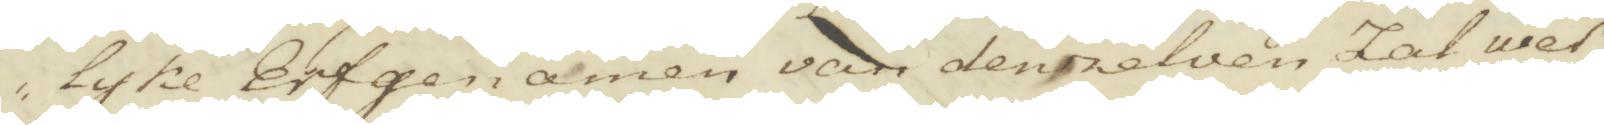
„lyke Erfgenamen van denzelven zal wer
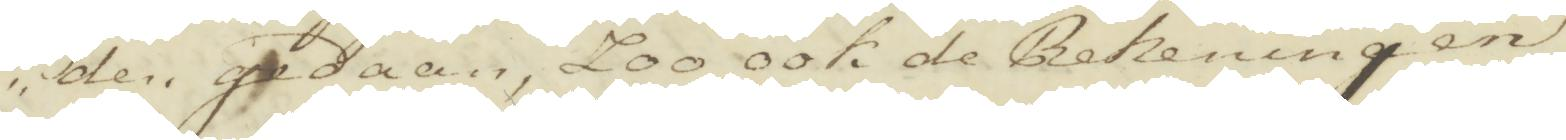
„den gedaan, zoo ook de Rekening en
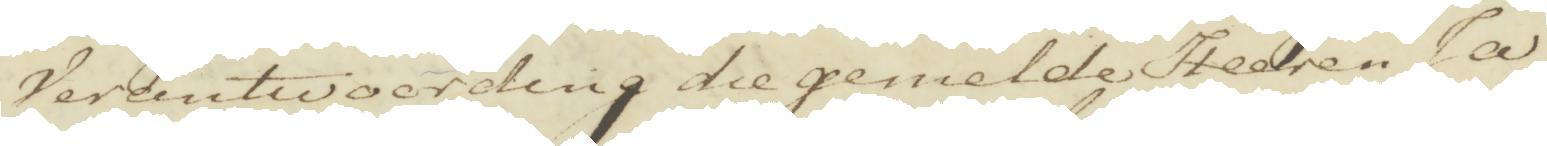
verantwoording die gemelde Heeren Ja
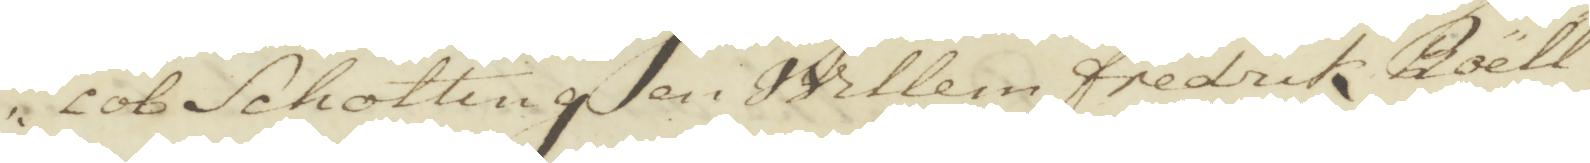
„cob Scholting en Willem fredrik Roell
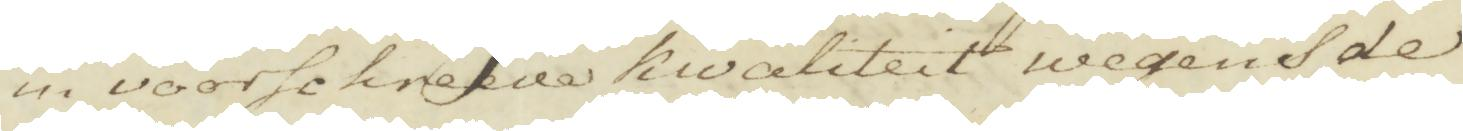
in voorschreeve kwaliteit wegens de
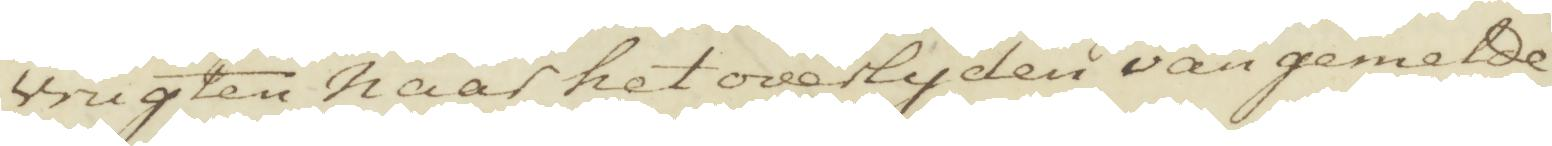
vrugten naar het overlyden van gemelde
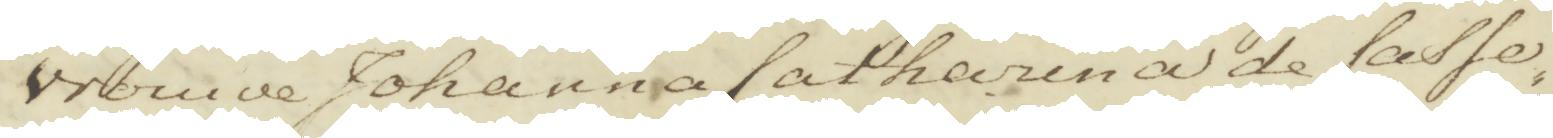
vrouwe Johanna Catharina de Casse„
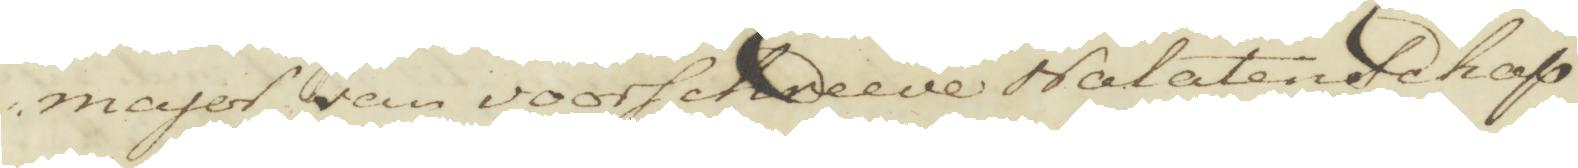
„majer van voorschreeve Nalatenschap
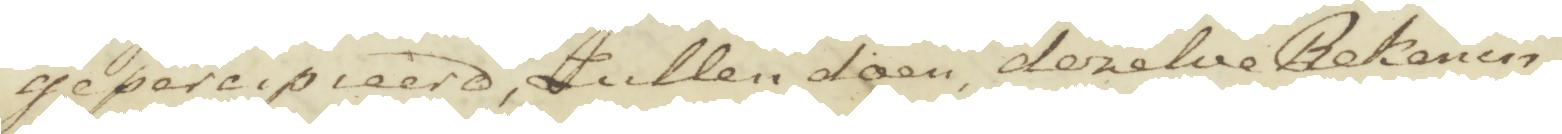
gepercipieerd, zullen doen, dezelve Rekenin
